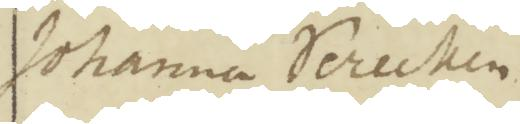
Johanna Vereeken
